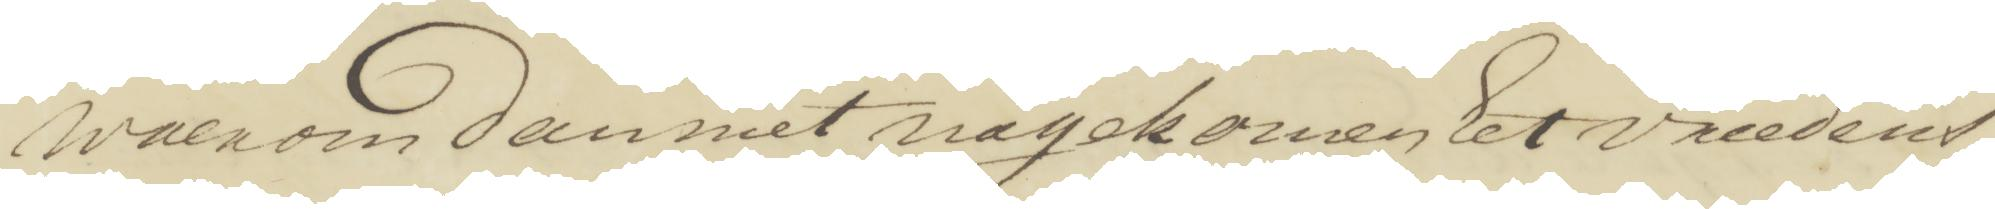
waerom dan niet nagekomen het vreedens
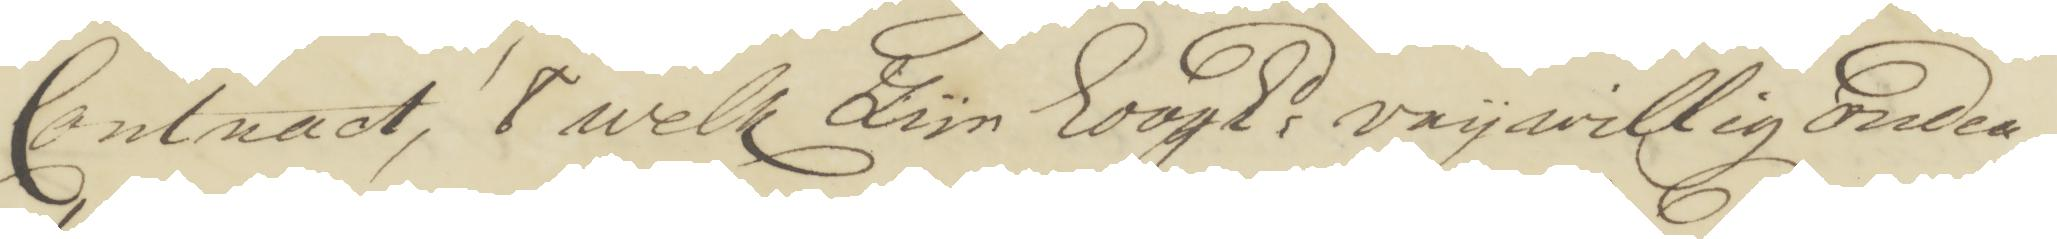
Contract, ’t welk zijn hoogh:d vrijwillig onder
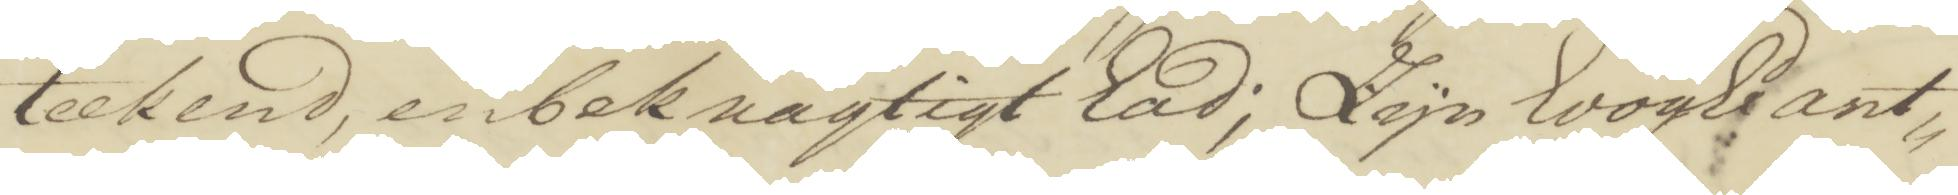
teekend, en bekragtigt had; zijn hoogh:d ant„
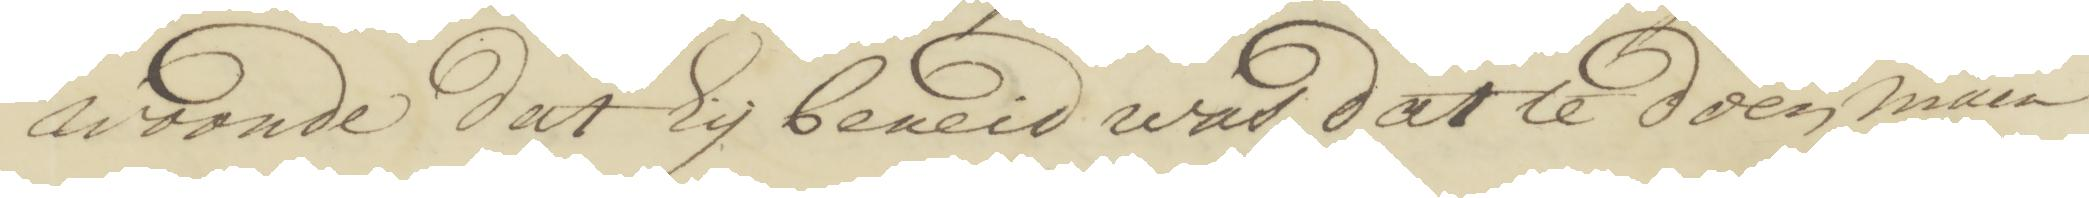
woorde dat hij bereid was dat te doen maer
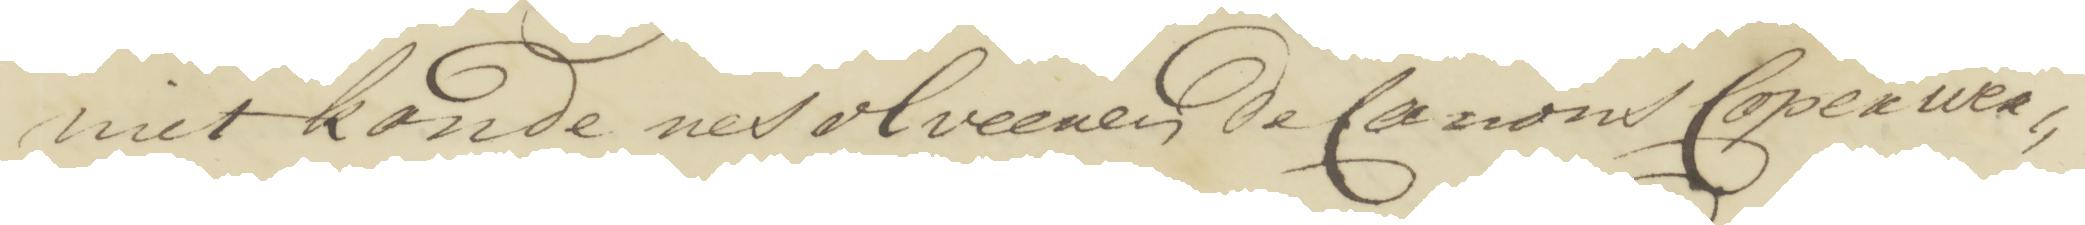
niet konde resolveeren de Canons Coper wer„
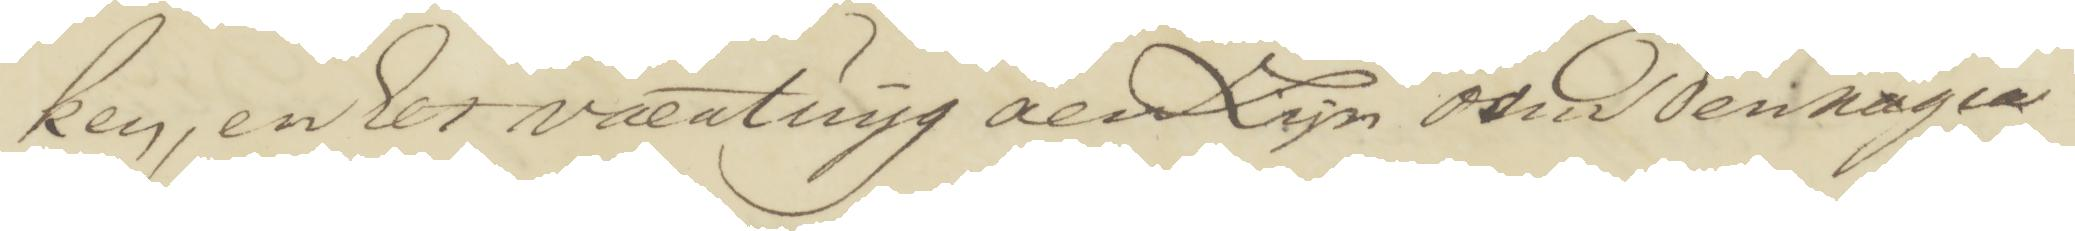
ken, en het vaertuijg aen zijn oom den ragia
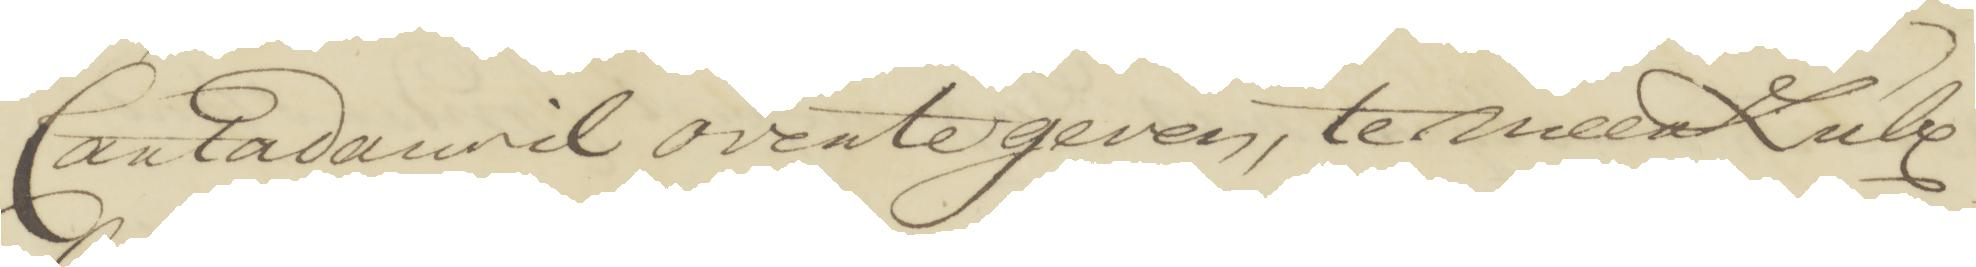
Cartadauril over te geven, te meer zulx
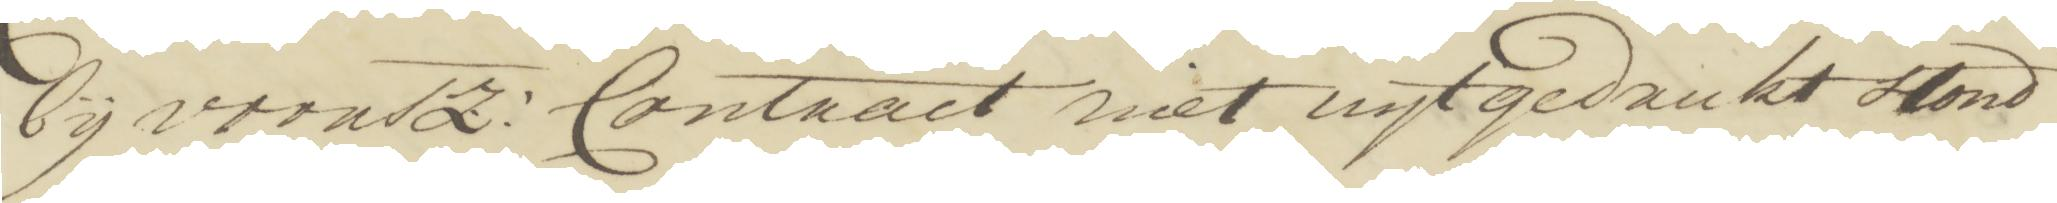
bij voorsz: Contract niet uytgedrukt stond
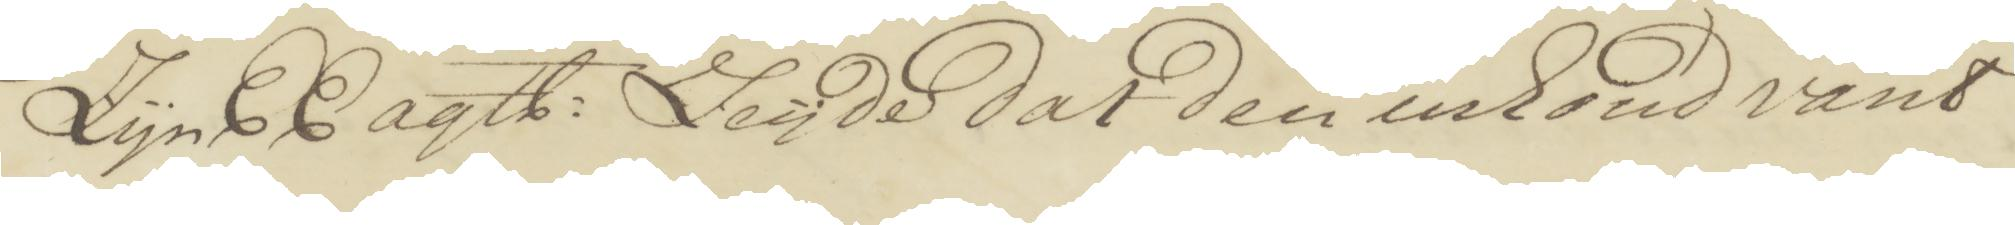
zijn EE agtb: zeijde dat den inhoud van't
